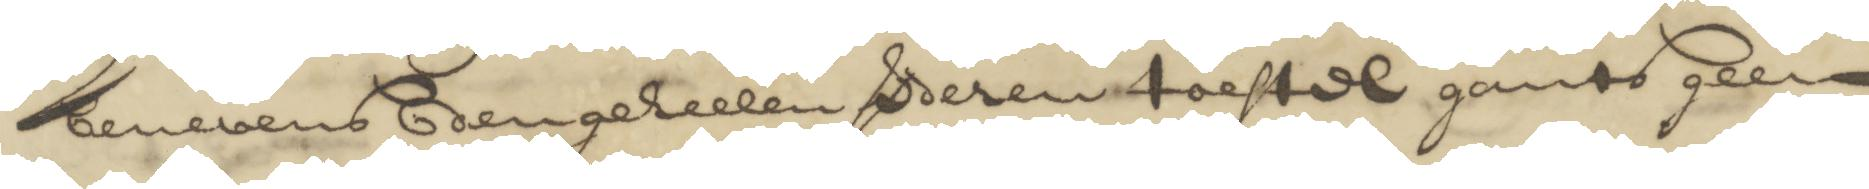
benevens den geheelen verderen toestel gants geen
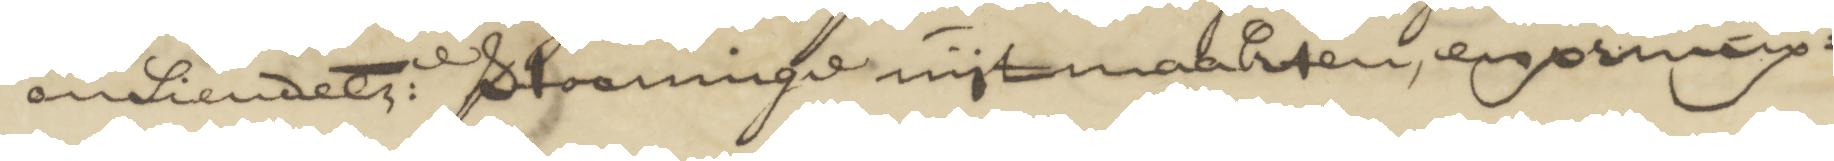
onsiendelijke vertoeninge uijtmaakten, en princip=e
